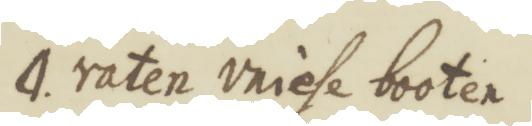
4. vaten vriese booter
